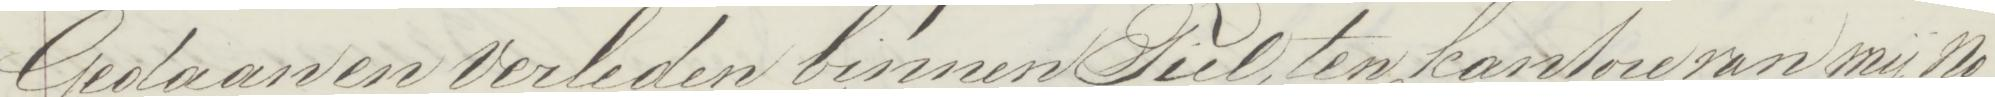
Gedaan en verleden binnen Tiel, ten kantore van mij No
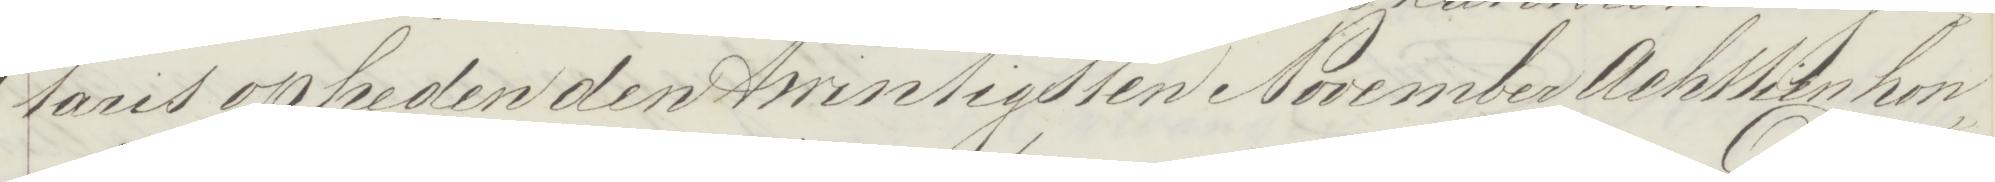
taris op heden den twintigsten November Achttien hon„
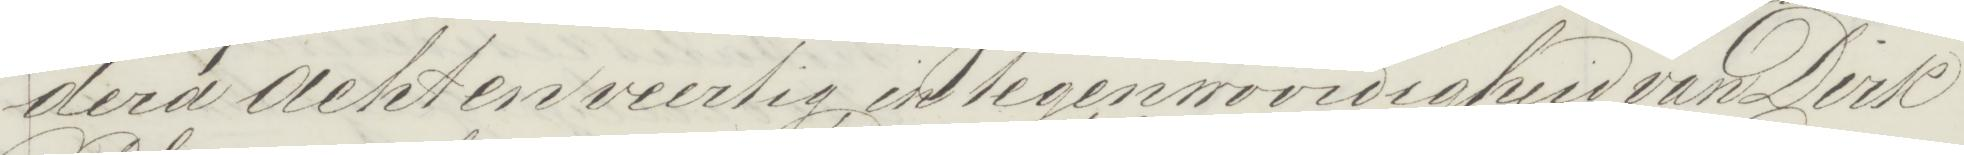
derd Acht en veertig, in tegenwoordigheid van Dirk
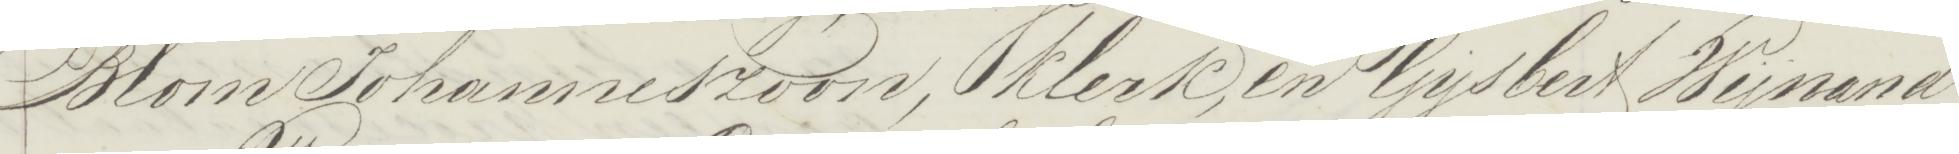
Blom Iohanneszoon, klerk, en Gijsbert Wijnand
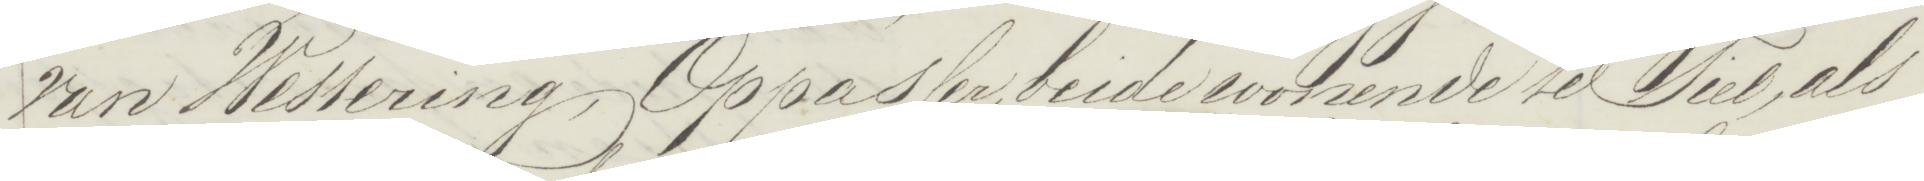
van Westering, Oppasser, beide wonende te Tiel, als
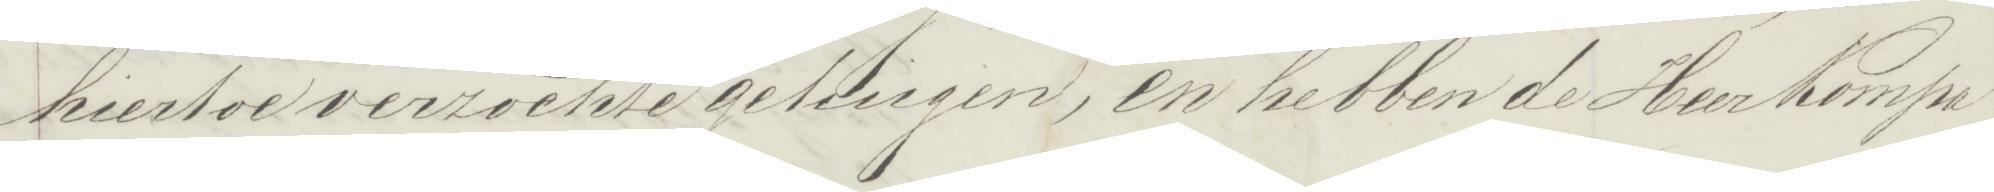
hiertoe verzochte getuigen, en hebben de Heer Kompa
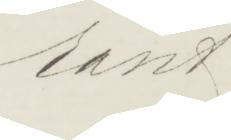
rant
